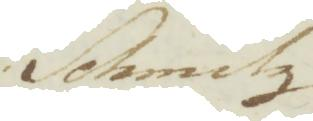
P. Schmitz
